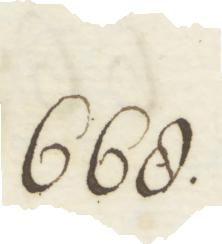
668.
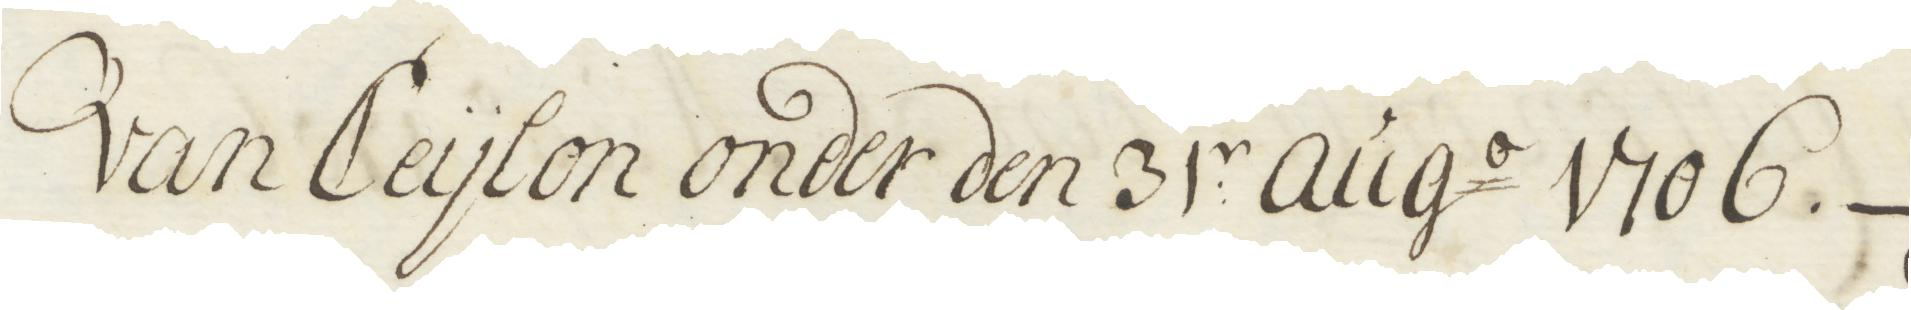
Van Ceijlon onder den 31:e aug=o 1706.—
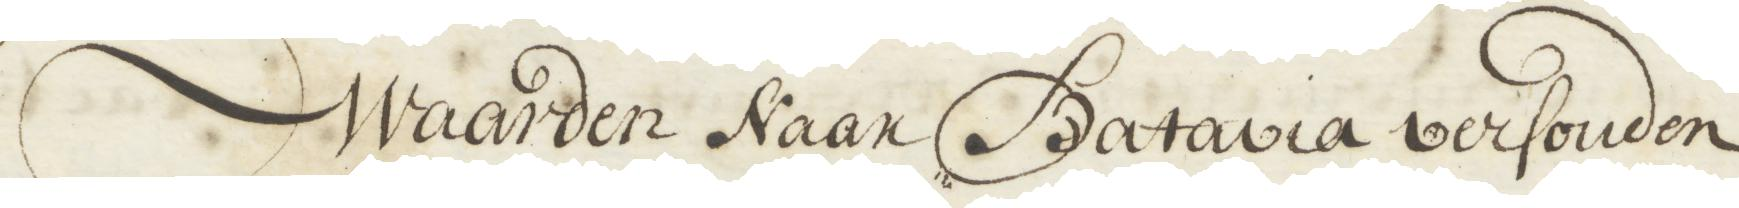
Waarden Naar Batavia versonden
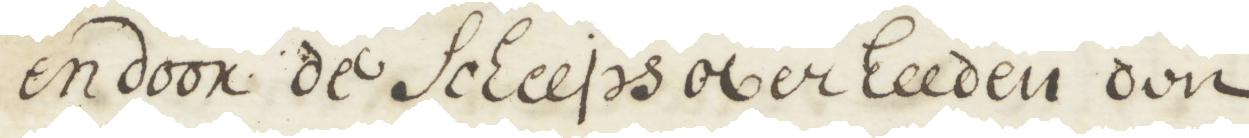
en door de scheeps over heeden den
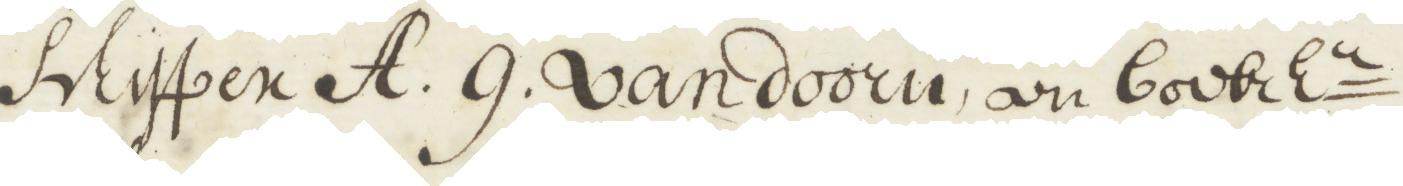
schipper A. 9. van doorn, en boekh=r
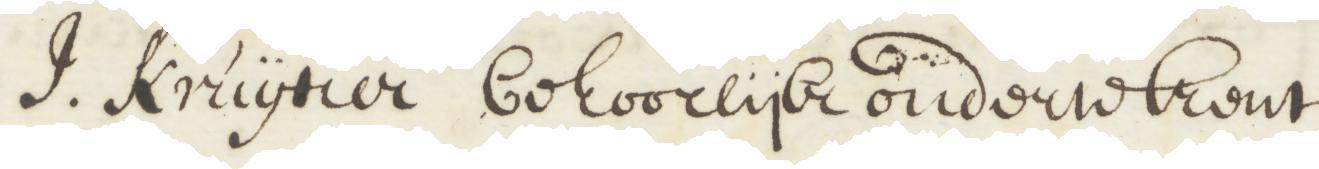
I. Kruijtier behoorlijk ondertekent
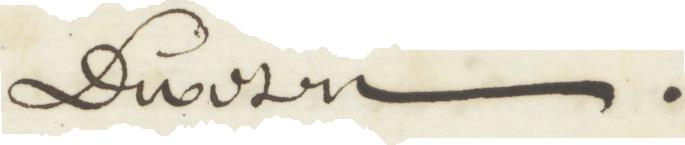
teweten.
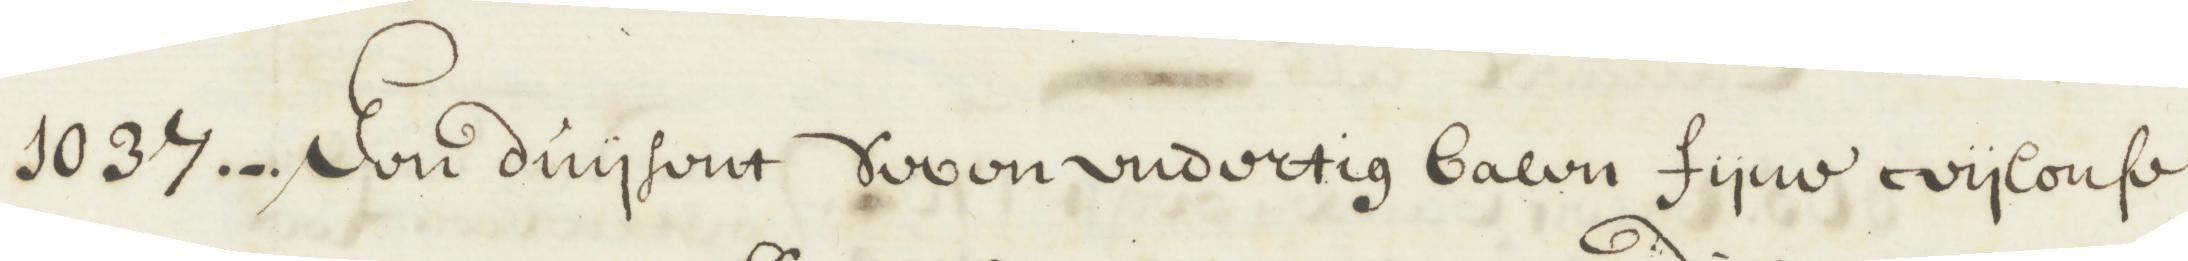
1037.-. Een duijsent Seven en dertig balen fijne ceijlonse
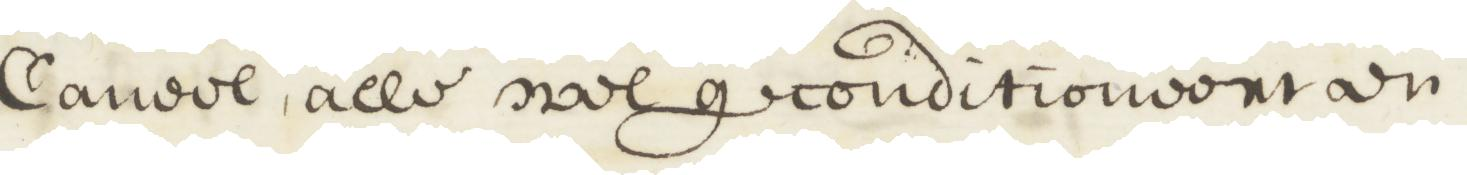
Caneel, alle wel geconditioneert en
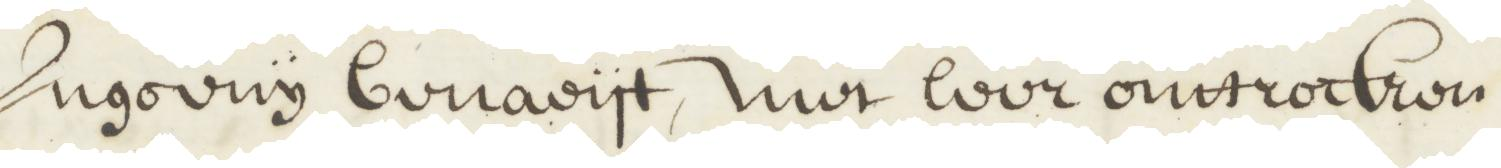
jngoenij benaeijt, met leer omtrocken
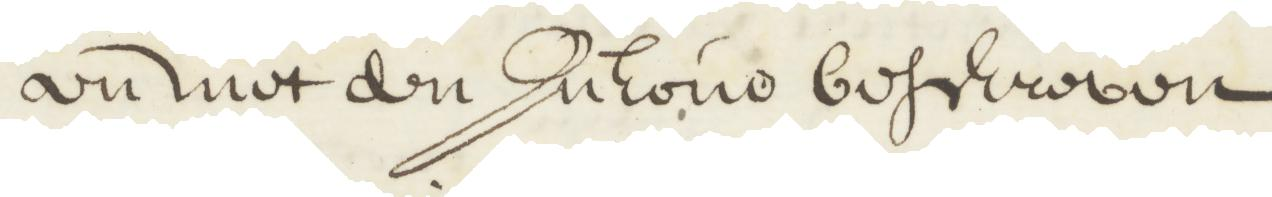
en met den Jnhoud beschreven
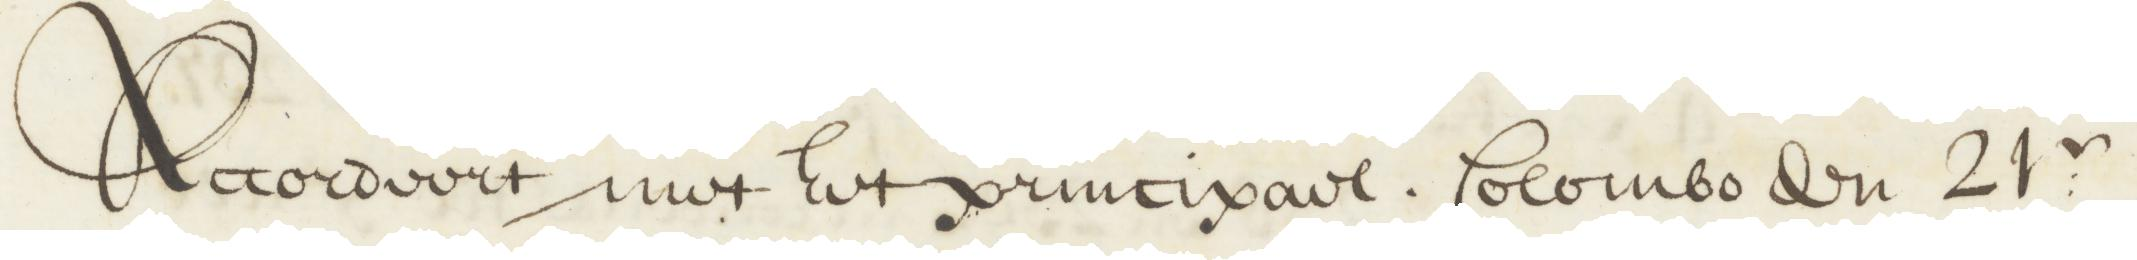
Accordeert met het principael. Colombo den 21:e
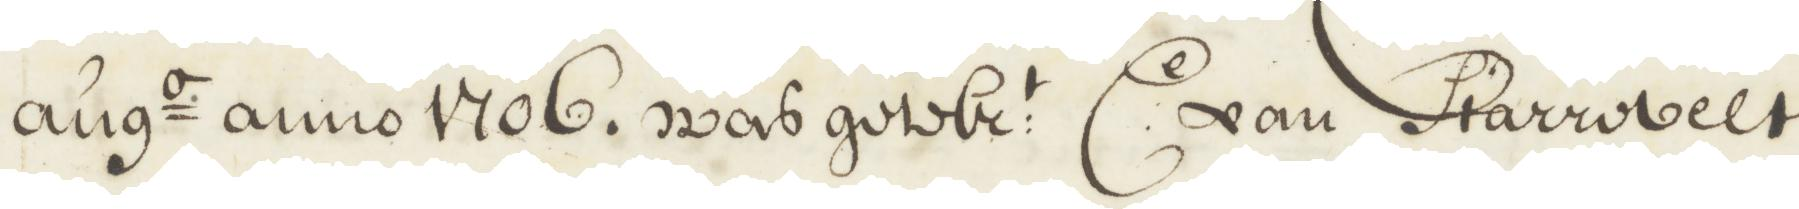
aug=o anno 1706. was getek:t C: van Starrevelt
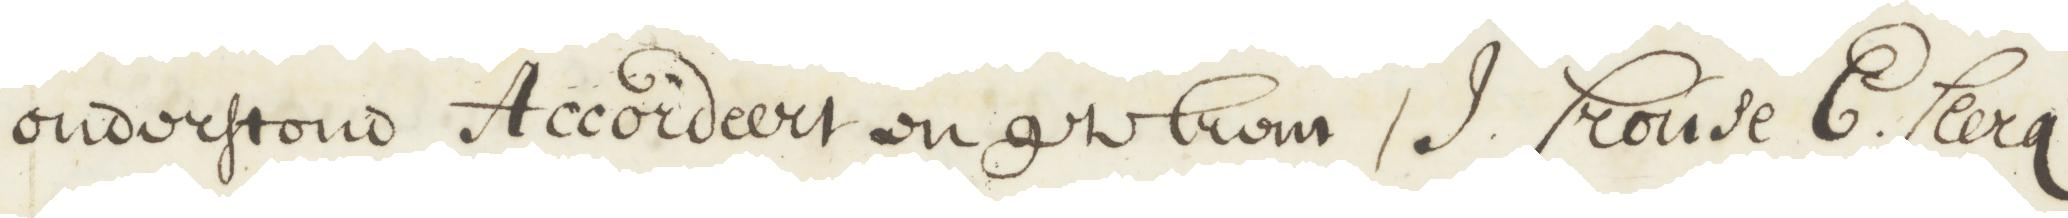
onderstond Accordeert en getekent / I: Crouse E. Clerq
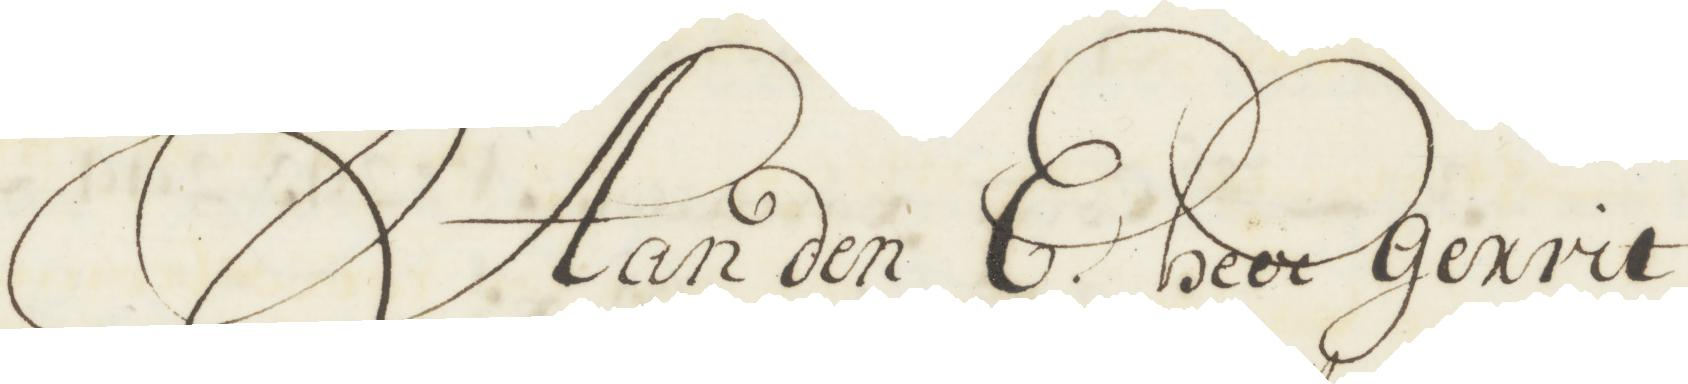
Aan den E: heer gerrit
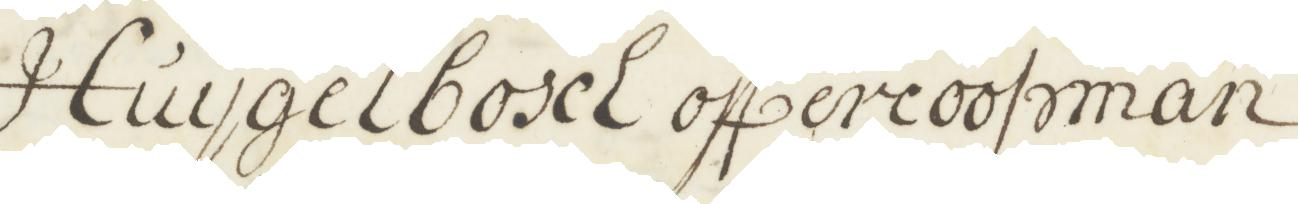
Huijgelbosch oppercoopman
